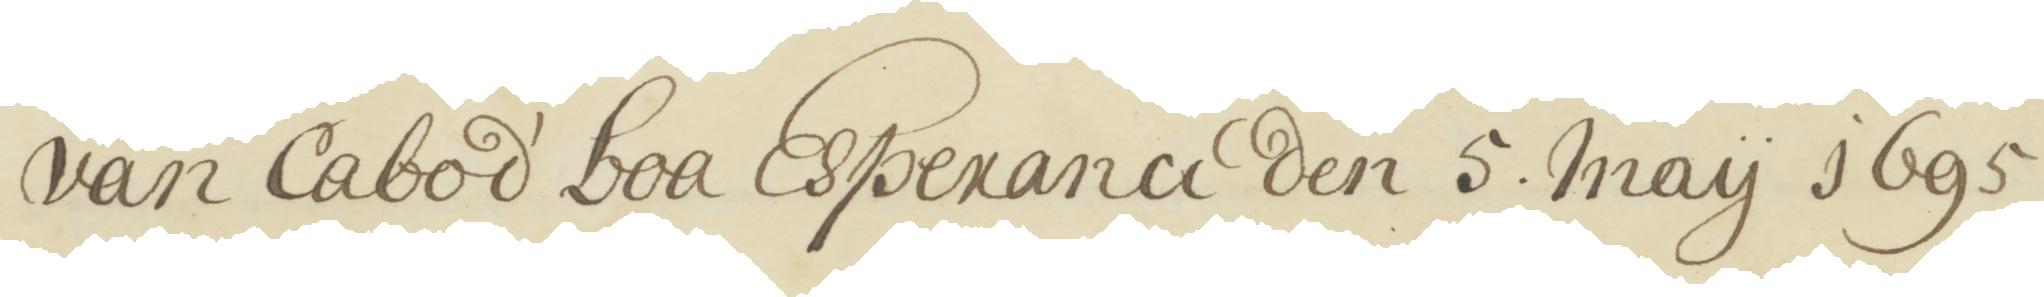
van Cabod' boa Esperance den 5. Maij 1695
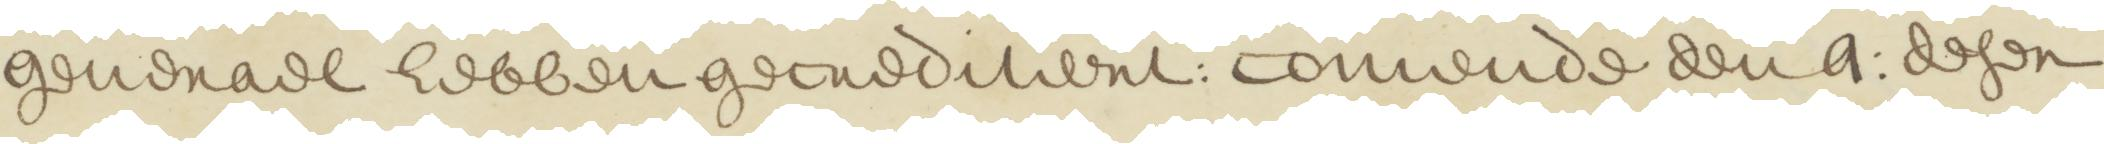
generael hebben gecrediteert: comende den 4: deser
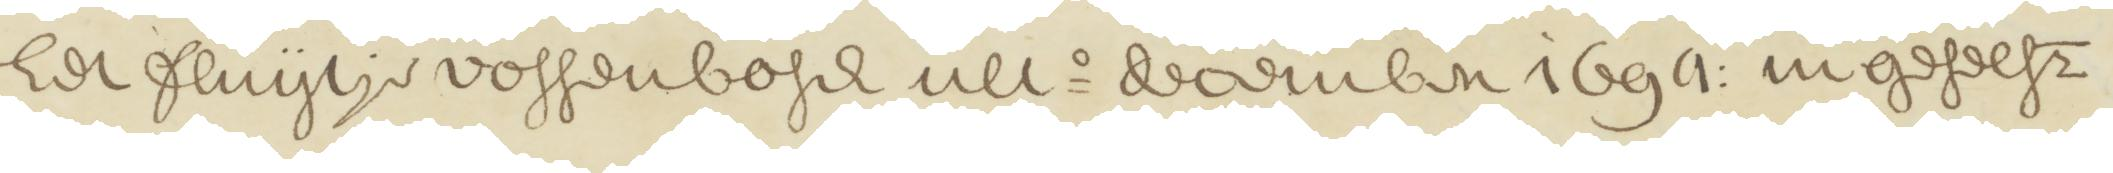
het fluijtje vossenbosch ult=o december 1694: in geselsz
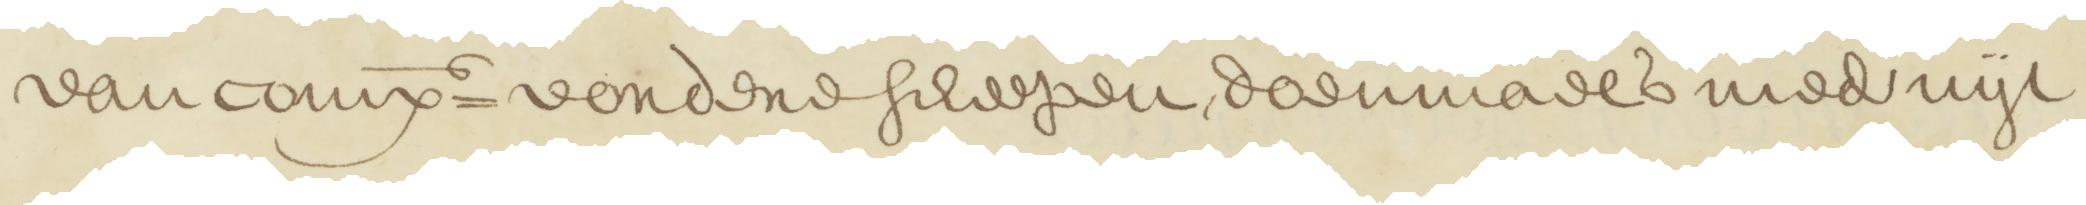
van comp=s vordere scheepen, doenmaels mede uijt
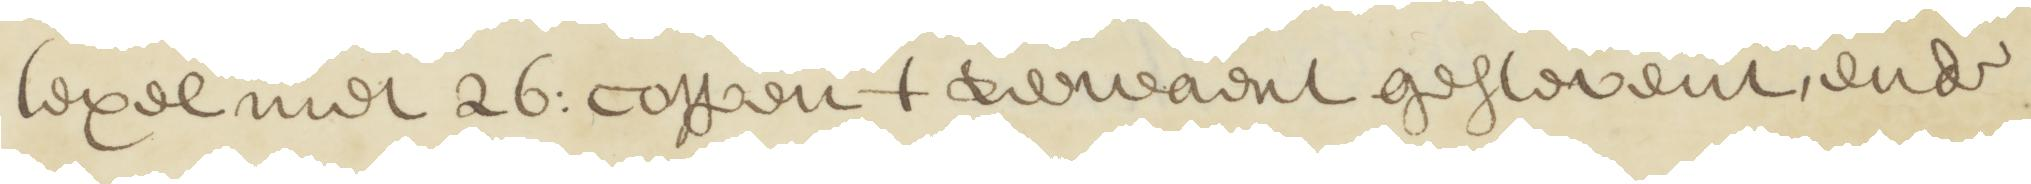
texel met 26: coppen 't zeewaert gestevent, ende
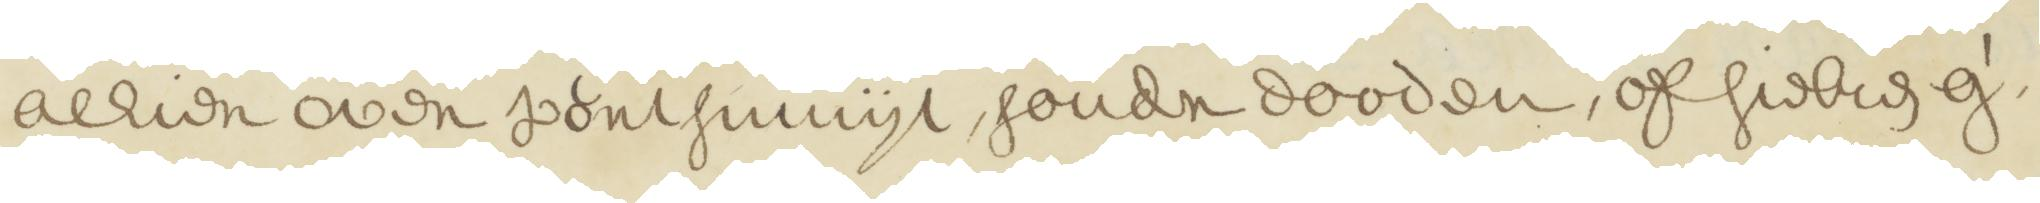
alhier over portsmuijt, sonder dooden, of sieken g'
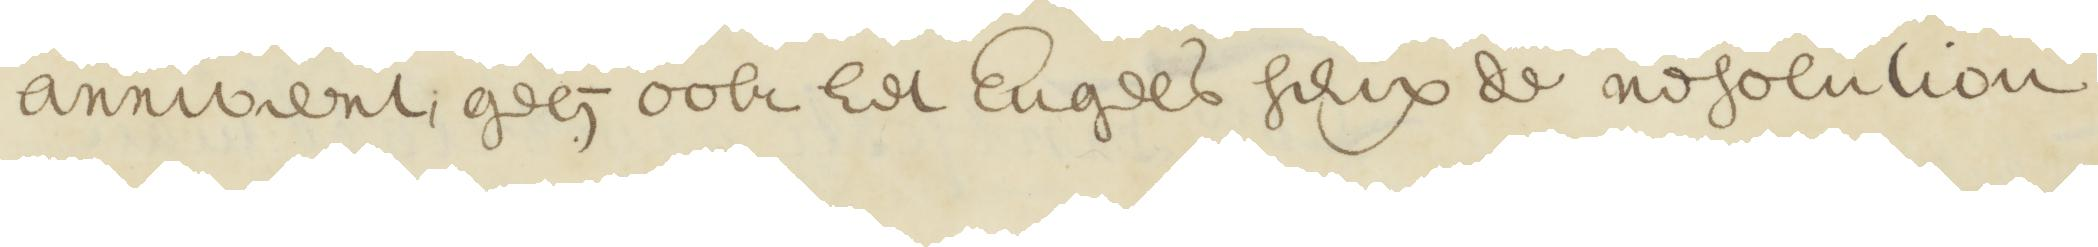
arriveert; gelijk ook het Engels schip de resolution
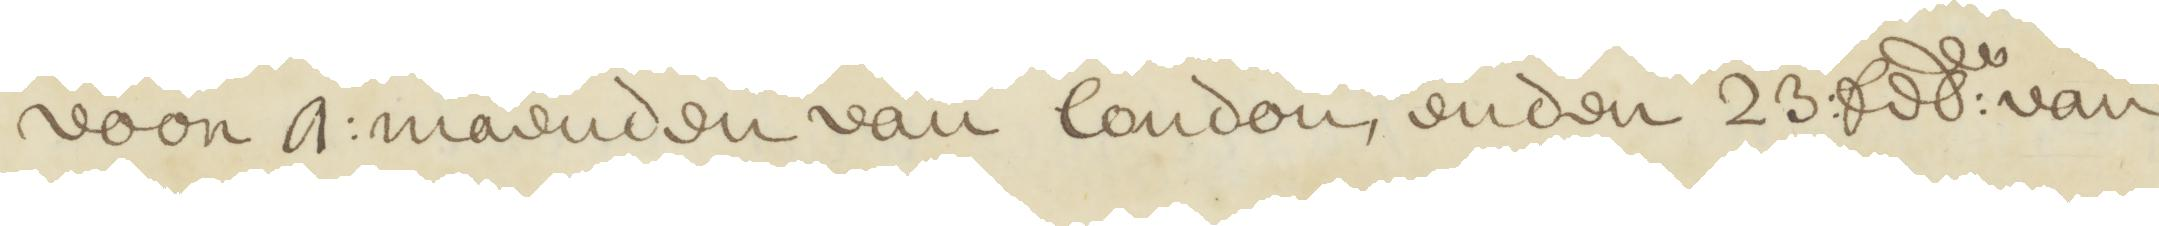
voor 4: maenden van london, en den 23. feb:e van
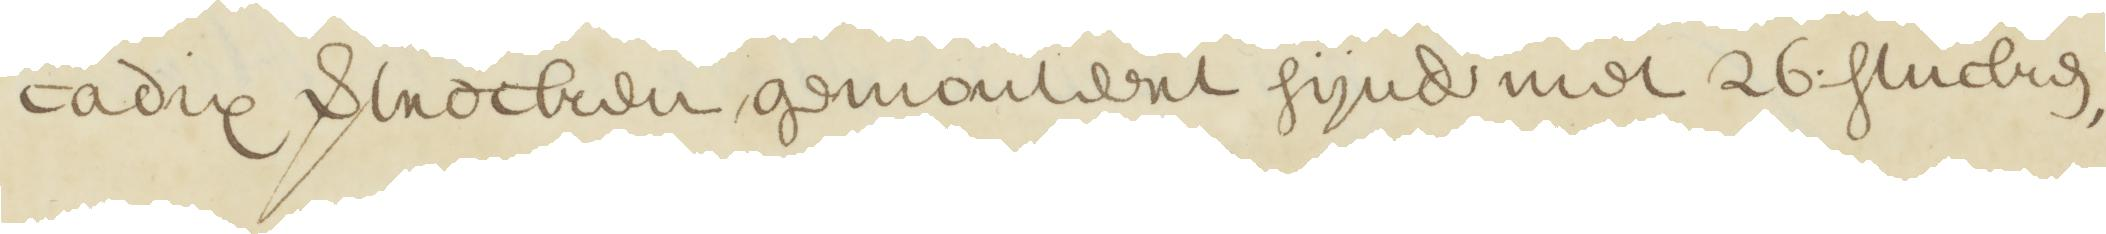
cadix vertrocken, gemonteert sijnde met 26: stucken
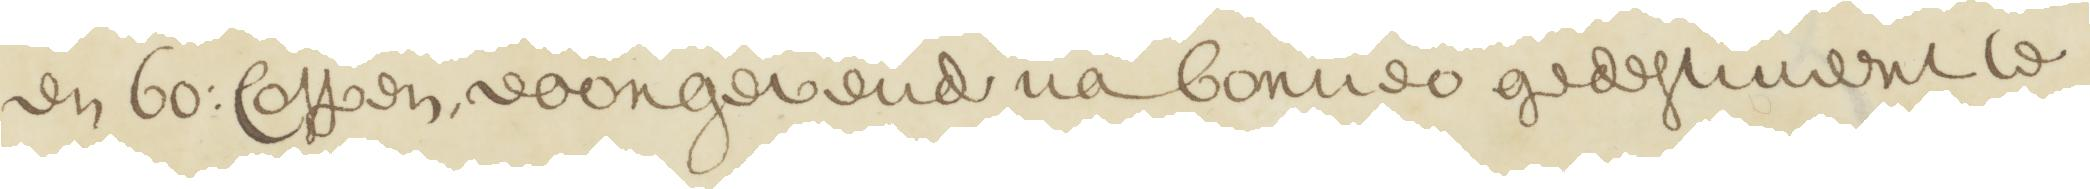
en 60: Coppen, voorgevende na borneo gedestineert te
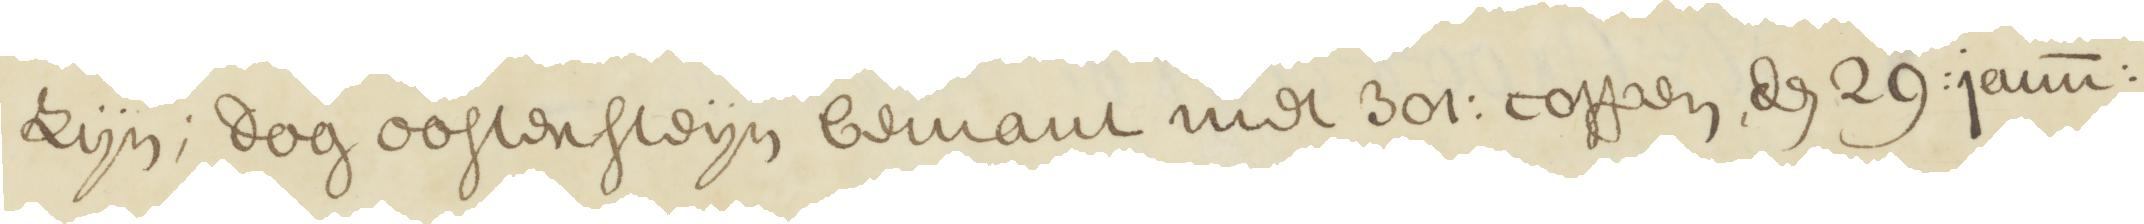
zijn; dog oostersteijn bemant met 301: coppen, den 29: jann:
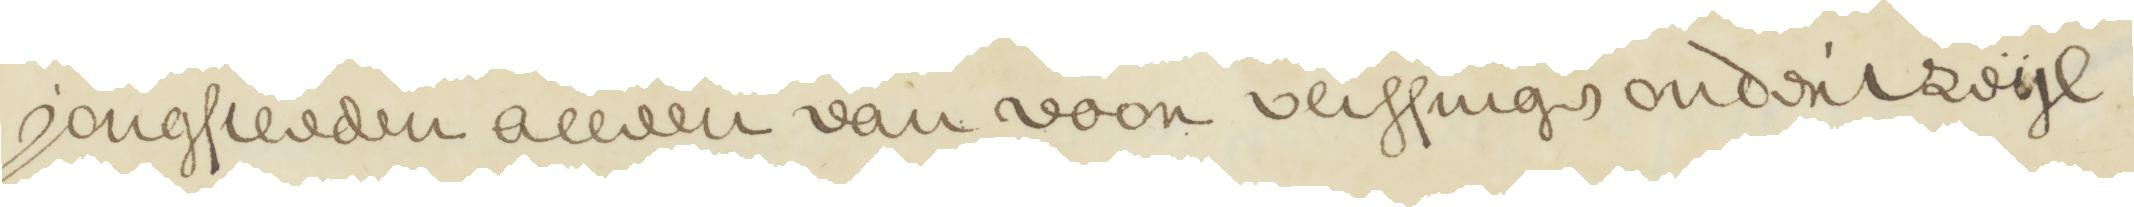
jongstleden alleen van voor vlissingen onder't zeijl
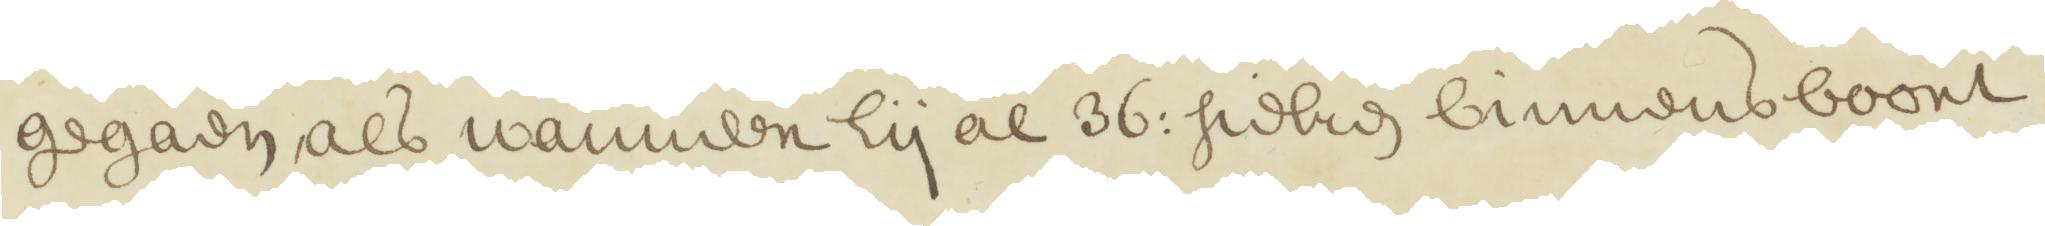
gegaen, als wanneer hij al 36: sieken binnens boort
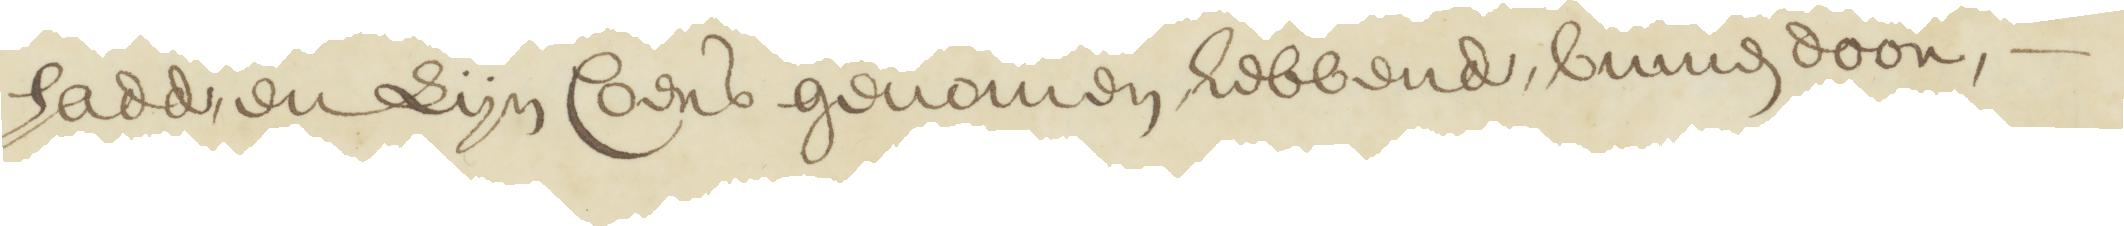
hadde, en zijn Coers genomen hebbende, binnen door, —
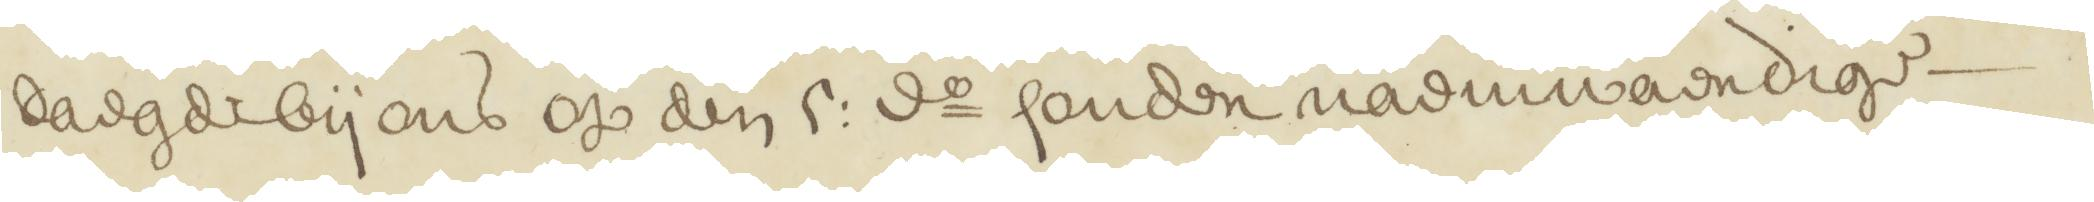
daegde bij ons op den 5: d=o sonder naemwaerdige —
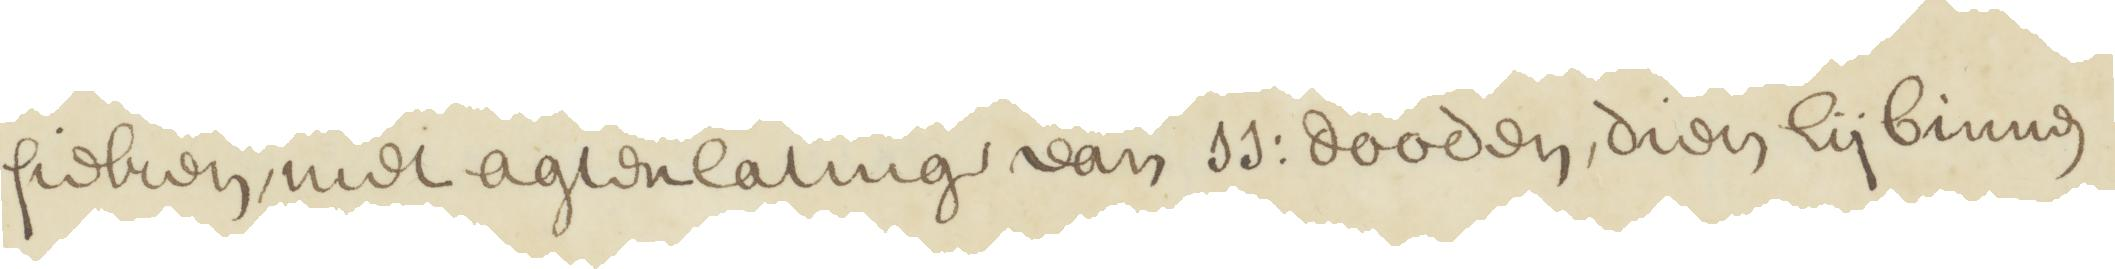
sieken, met agterlatinge van 11: dooden, dien hij binnen
